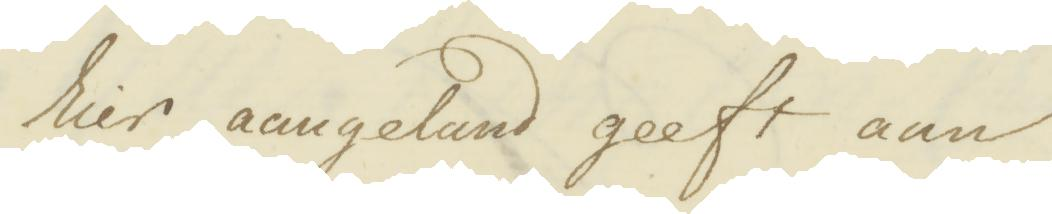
hier aangeland geeft aan
